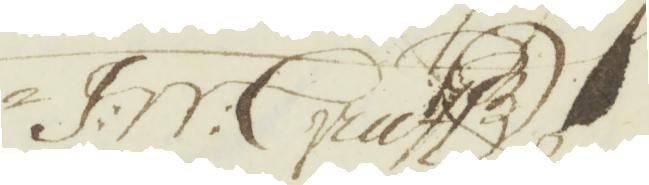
I: W: Greeff
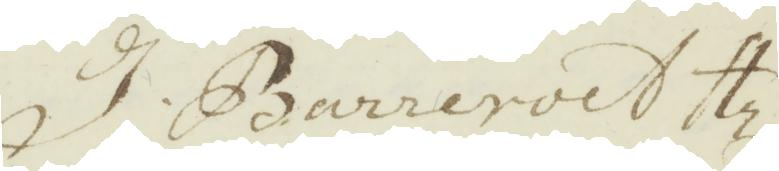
I: Barrevoet
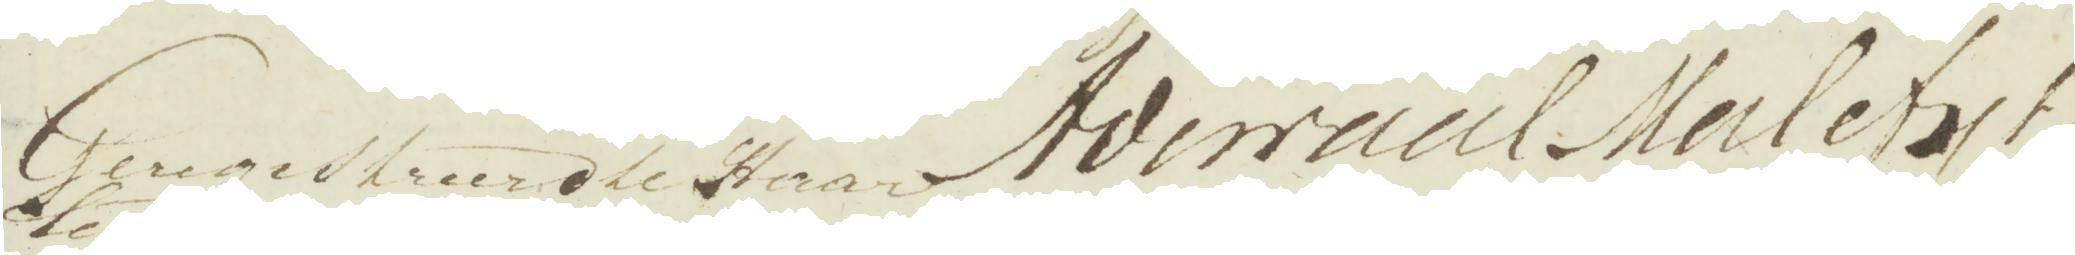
Geregistreerd te Haar Adewaal Malefyts
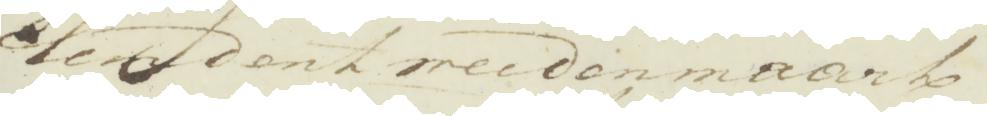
lem den tweeden maart
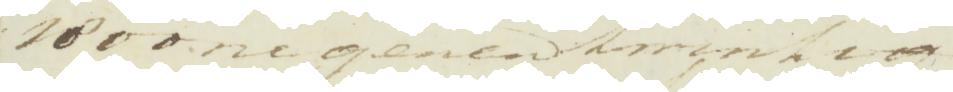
1800 negenentwintig
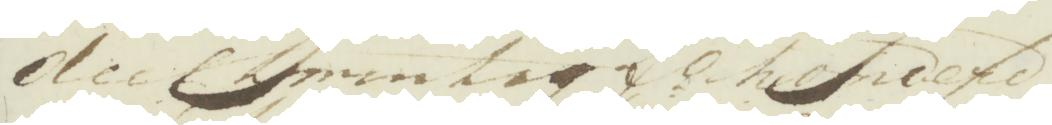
deel Twintig fo honderd
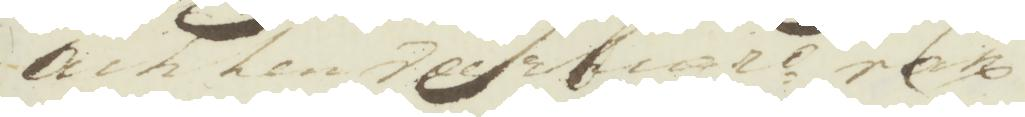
achten tachtig r=o vak
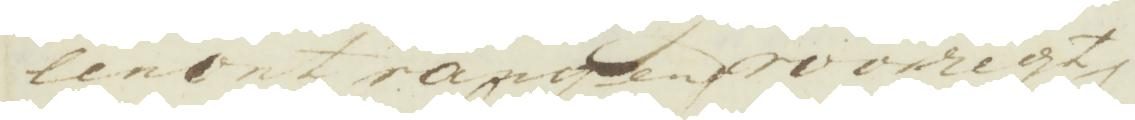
een ontvangen voorregt,
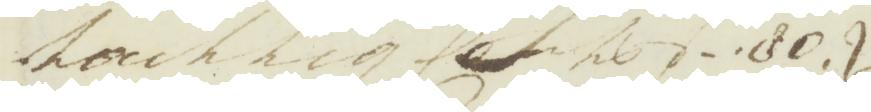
tachtig Cents ƒ - :80.
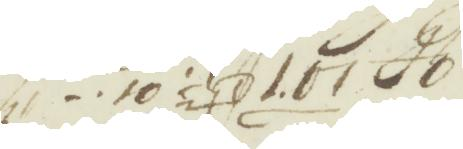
„- . 10½ ƒ 1.01 to
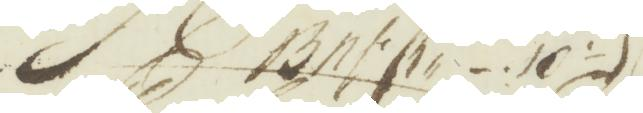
13 /cto „.10½
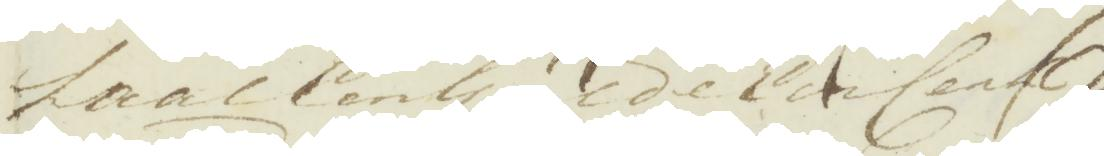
taal Een Gulden Een Cents
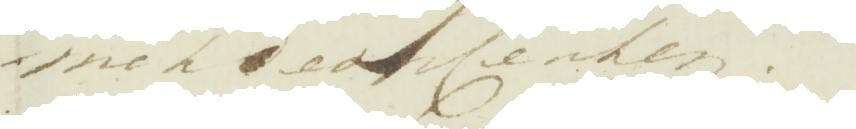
„met de opCenten.
